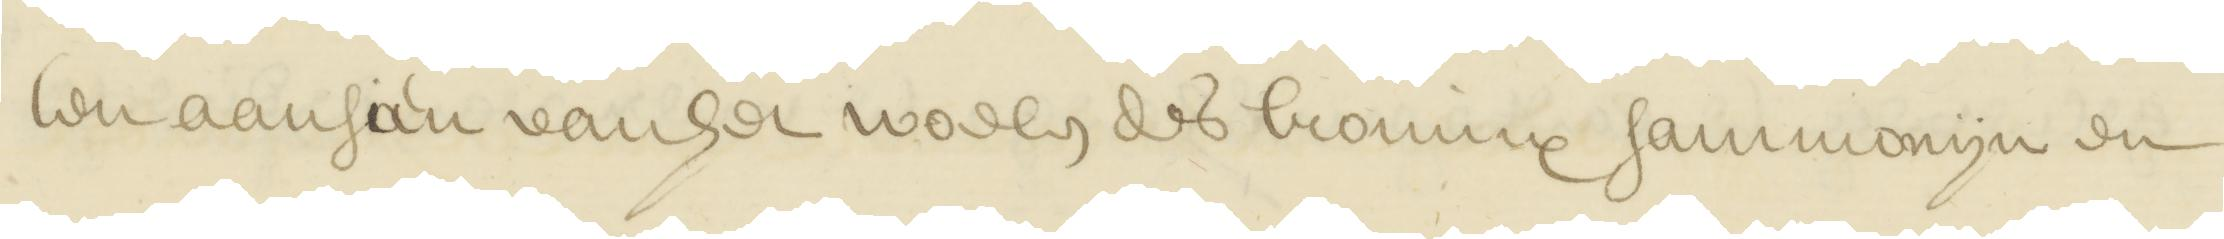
ten aansien van het woelen des koninx sammorijn en
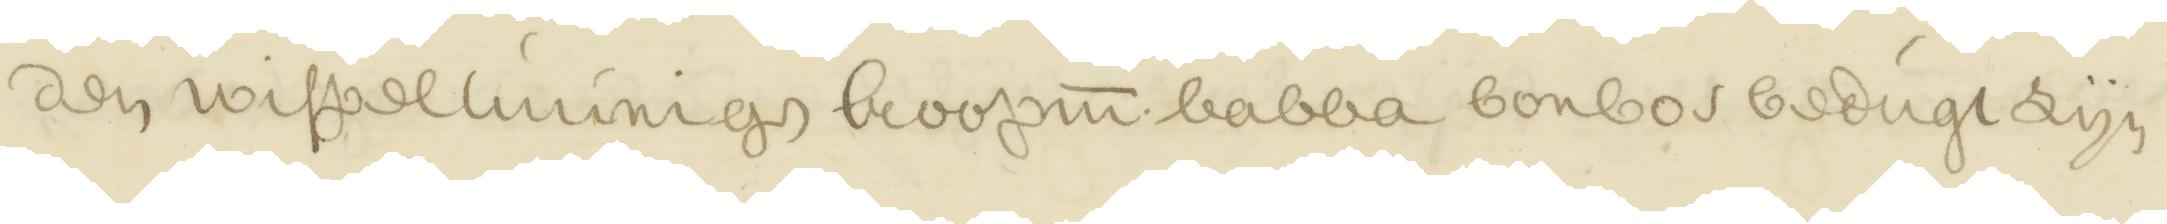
den wispeltuurigen koopm: babba borboe bedugt zijn
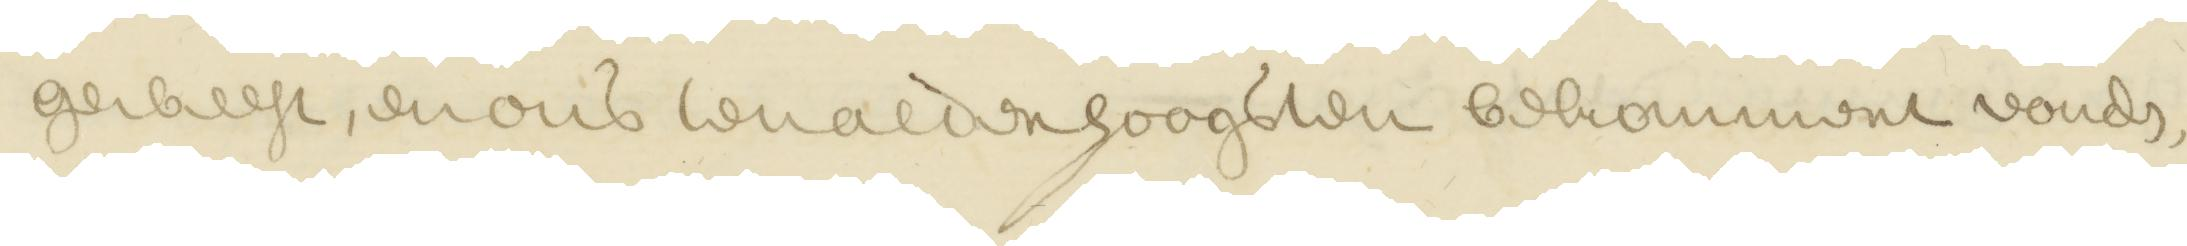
geweest, en ons ten alderhoogsten bekommert vonden,
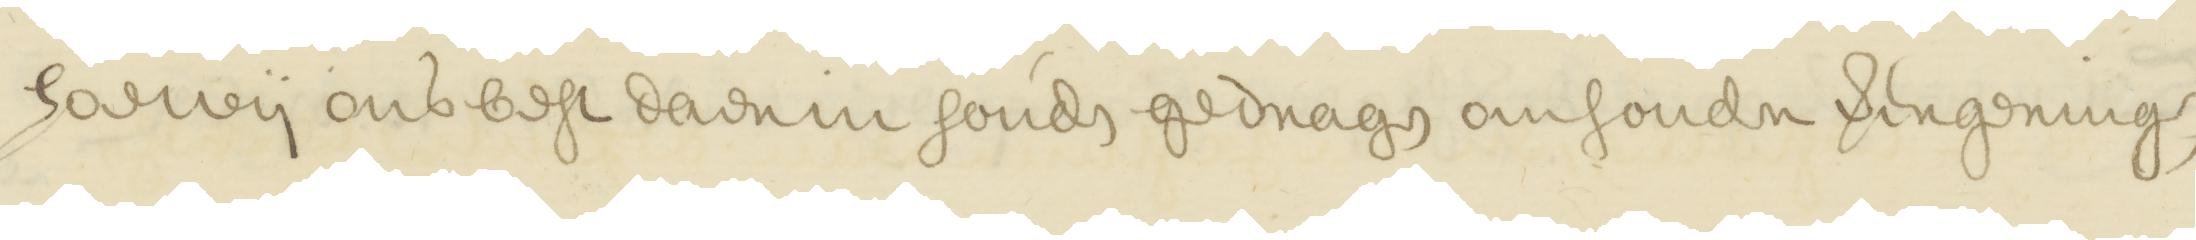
hoewij ons best daer in souden gedragen om sonder verergeringe,
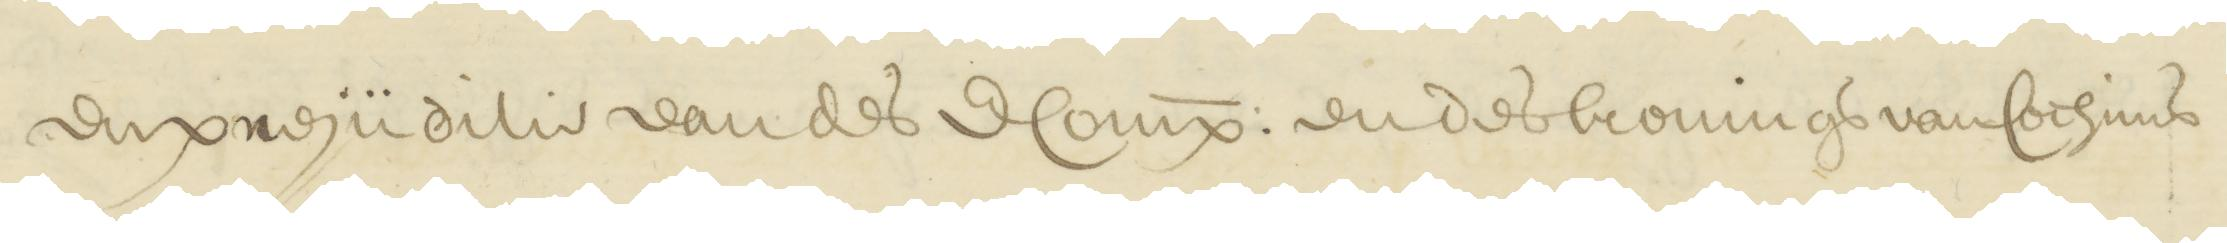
en prejüditie van des EComp: en des konings van Cochins
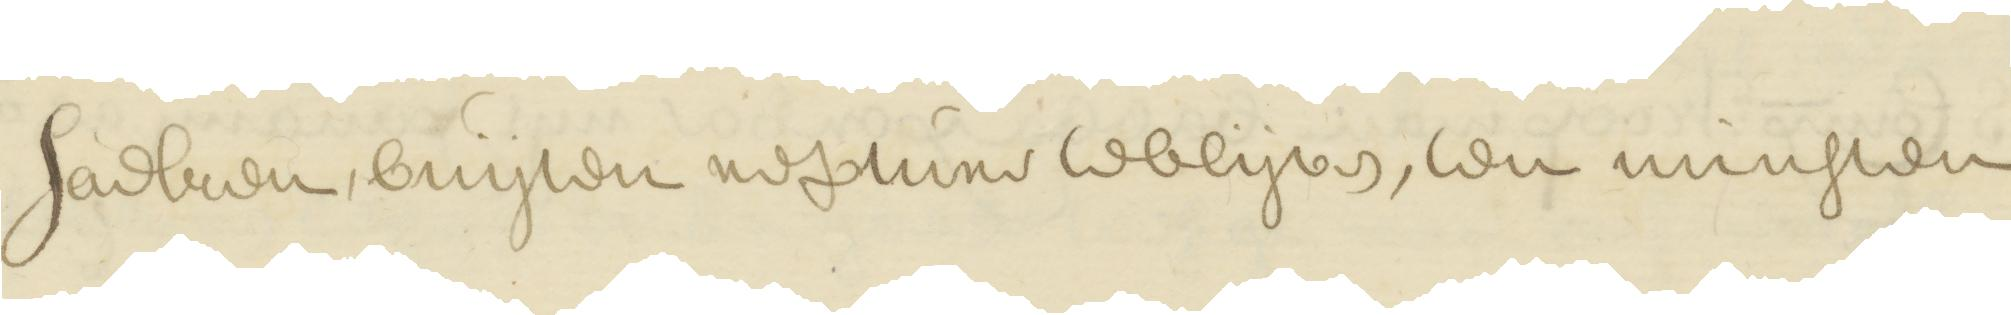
saeken, buijten repture te blijven, ten minsten
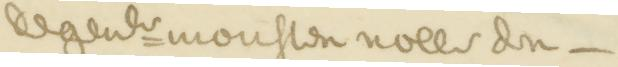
de gen=e monster rolle den _
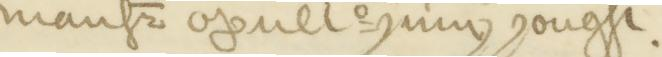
mansz op ul=o junij jongst.
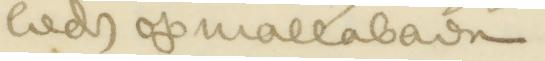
leden op mallabaer
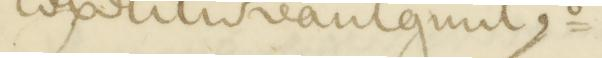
repetitie van 't gunt j=o
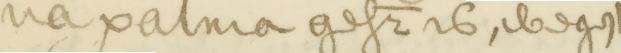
na patria gesz is, wegent
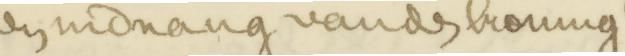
den indrang van den koning
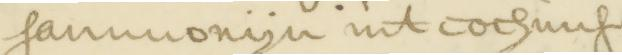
sammorijn in't cochinse
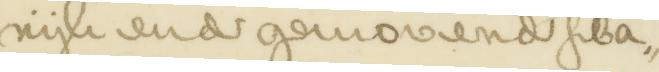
rijk ende gemoverde swa„
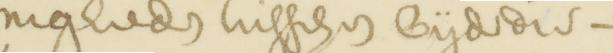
righeden tusschen bijde die –
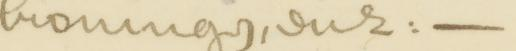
koningen, enz:—
